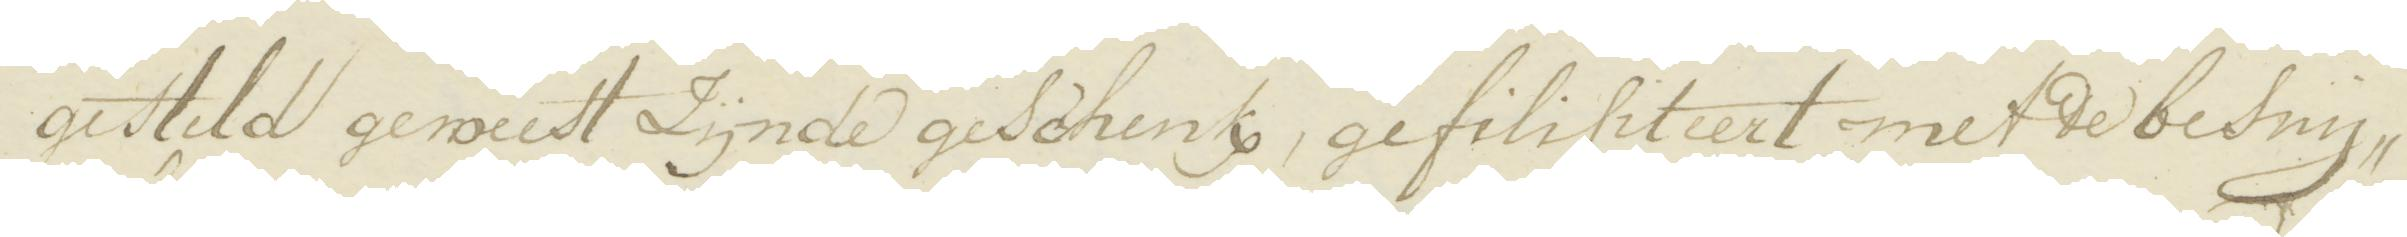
gesteld geweest zijnde geschenk, gefiliciteert met de besnij„
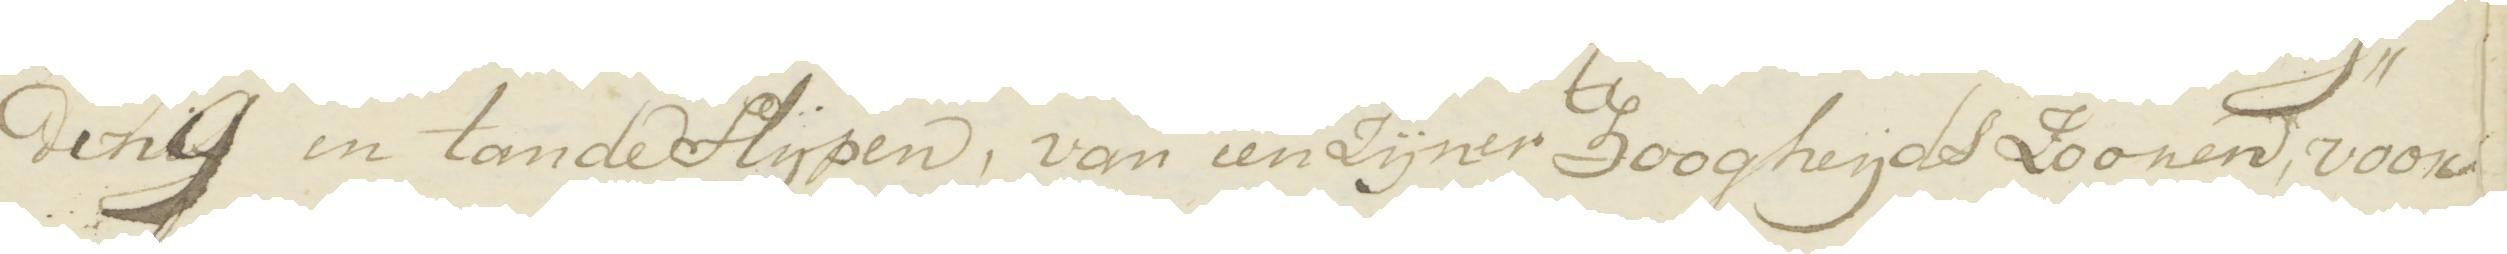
ding en tande slijpen, van een zijner Hoogheijds zoonen, voor
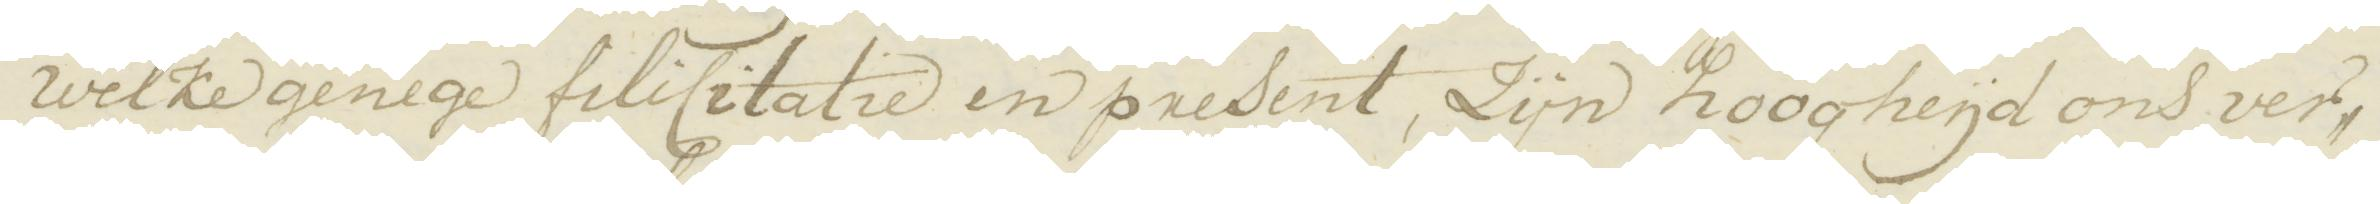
welke genege filicitatie en present, zijn hoogheijd ons ver„
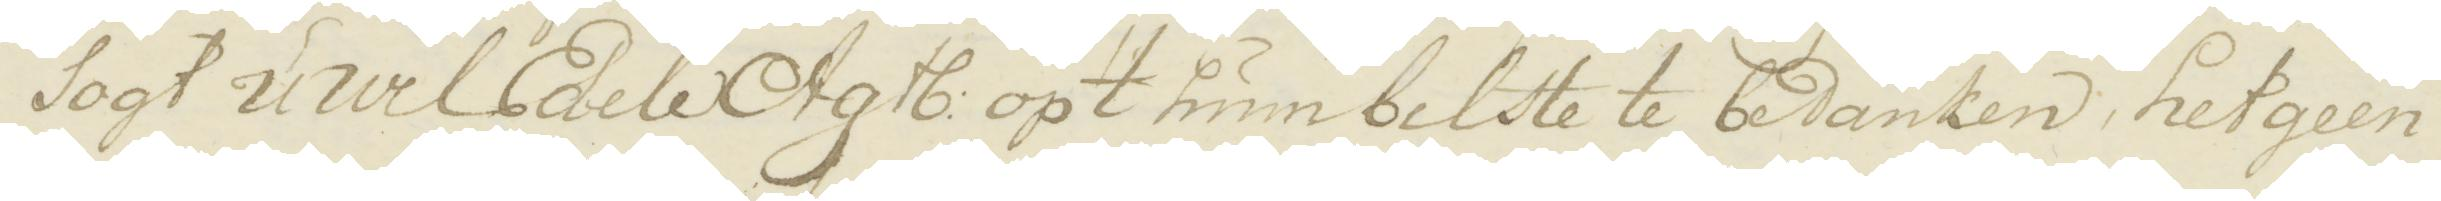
sogt u wel Edele Agtb: op’t humbelste te bedanken, het geen
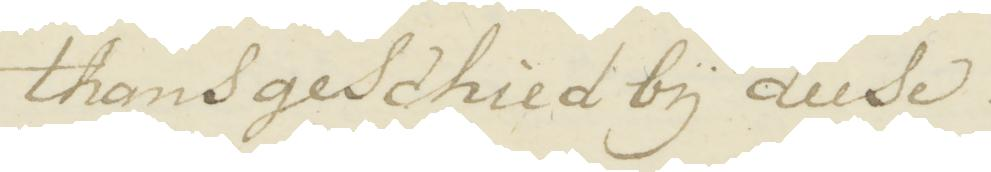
thans geschied bij deese
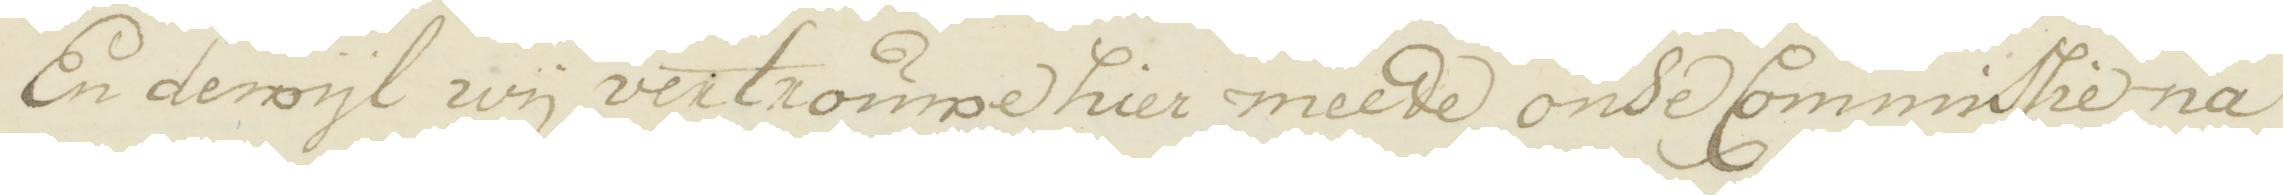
En dewijl wij vertrouwe hier meede onse Commissie na
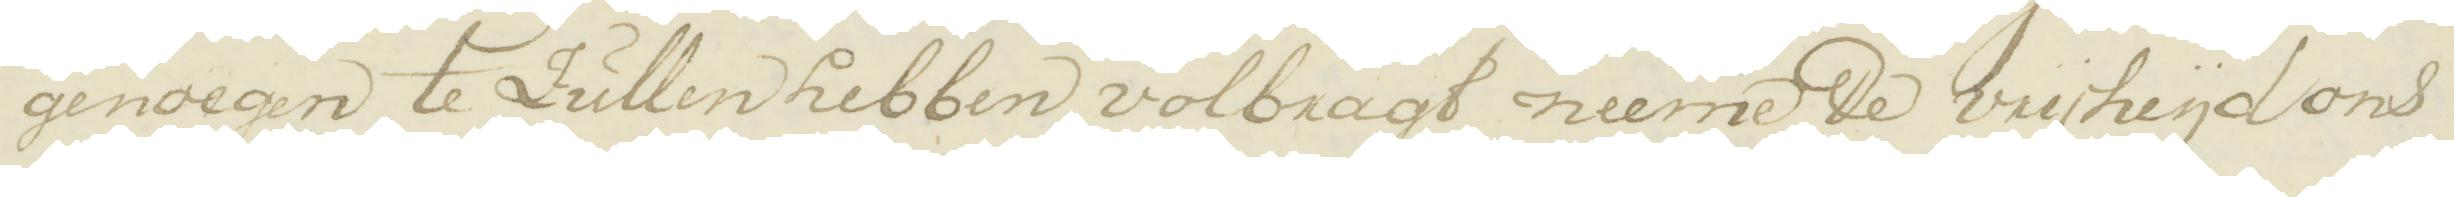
genoegen te zullen hebben volbragt neeme de vrijheijd ons
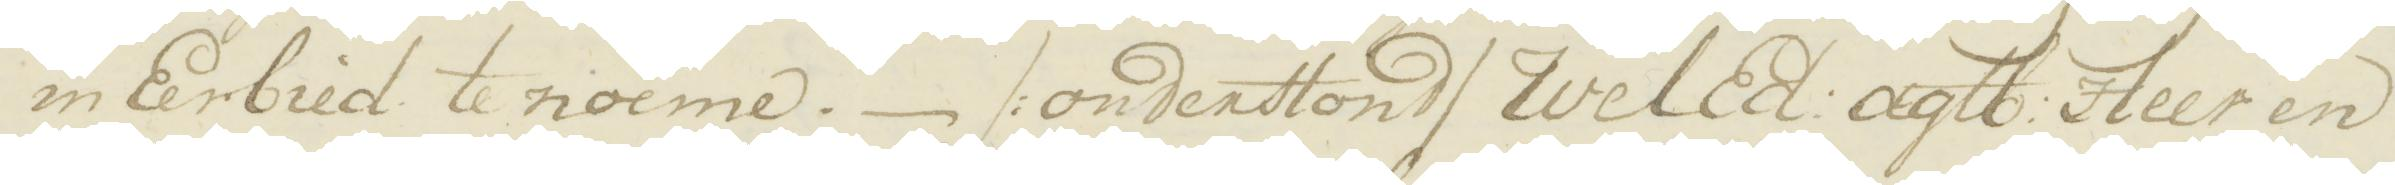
in Eerbied te noeme. — /:onderstond/ Wel Ed: agtb: Heer en
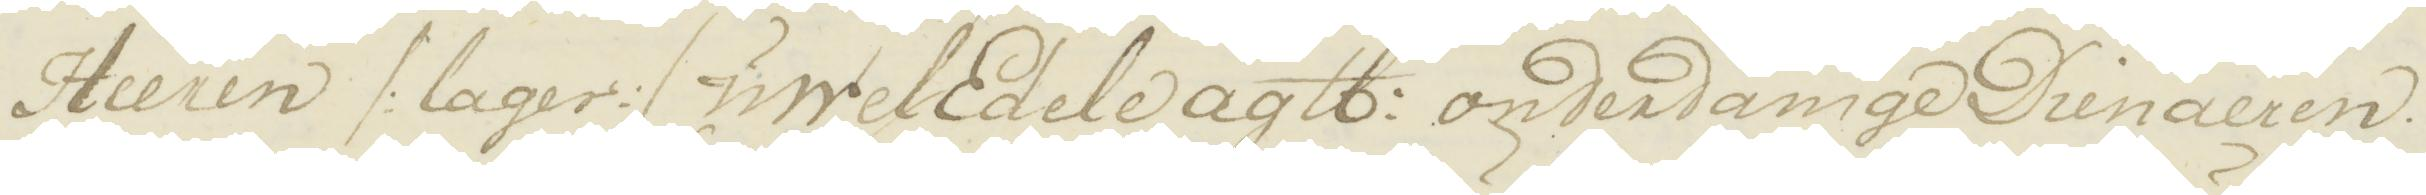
Heeren /:lager:/ uwel Edele agtb: onderdanige Dienaeren
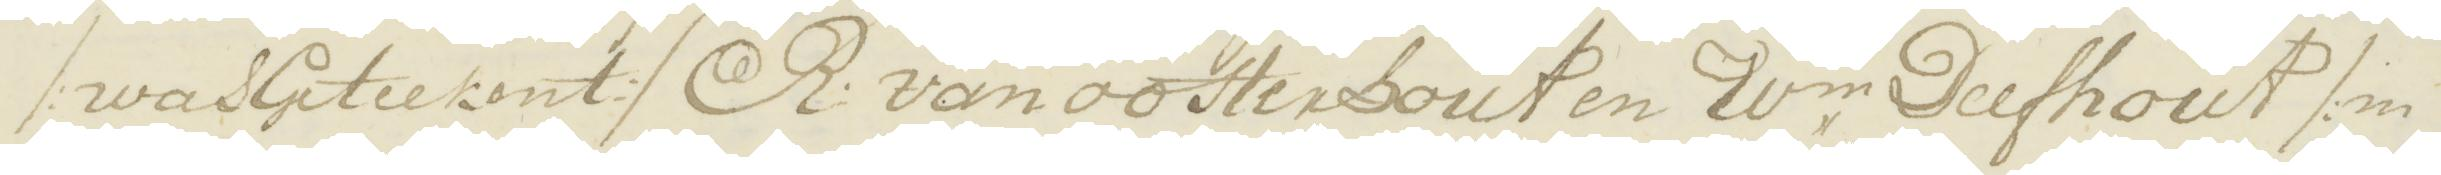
/:was Geteekent:/ R: van oosterhout en W„m Deefhout /:in
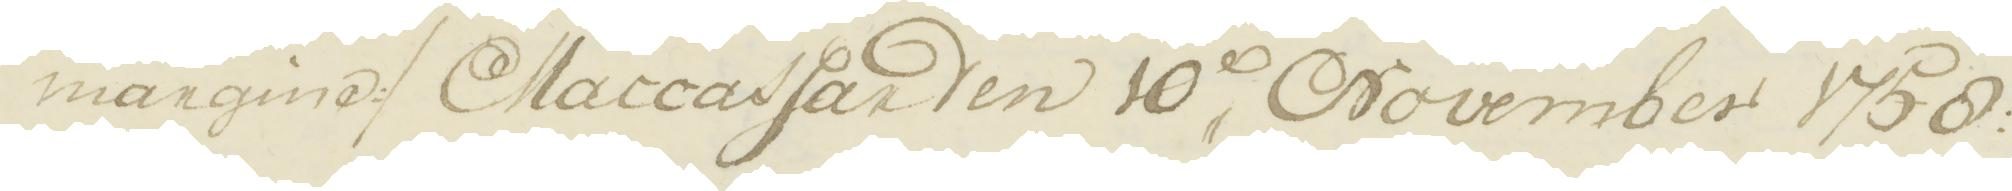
margine:/ Maccassar den 10„e November 1758
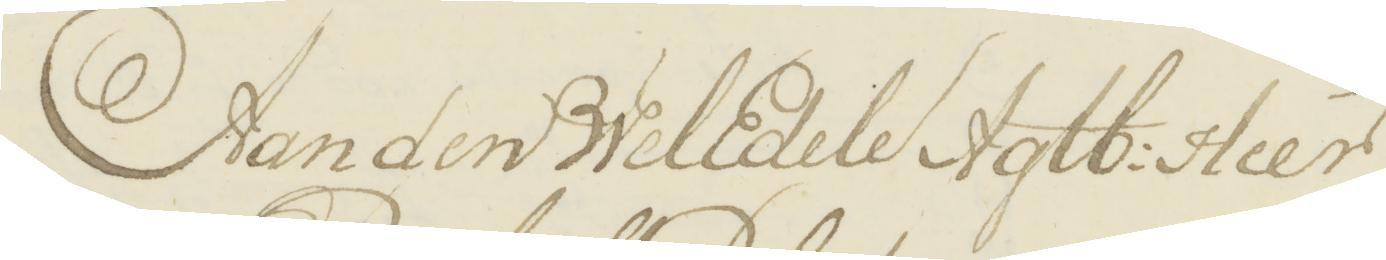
Aan den WelEdele Agtb: Heer
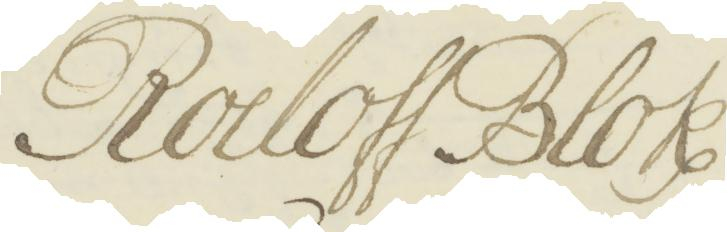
Roeloff Blok
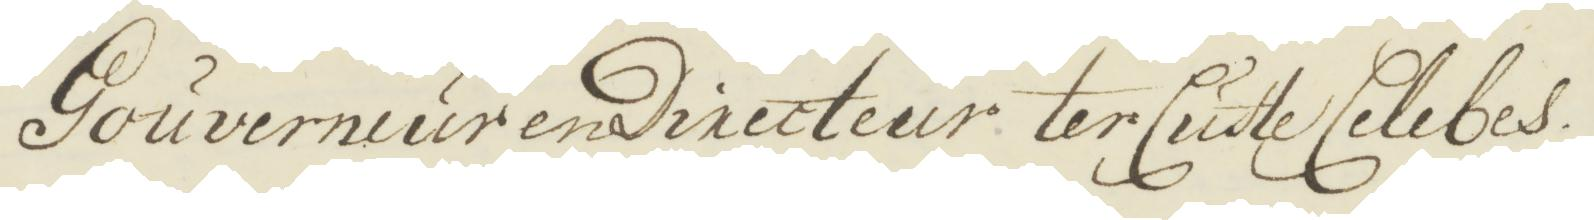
Gouverneur en Directeur ter Custe Celebes.
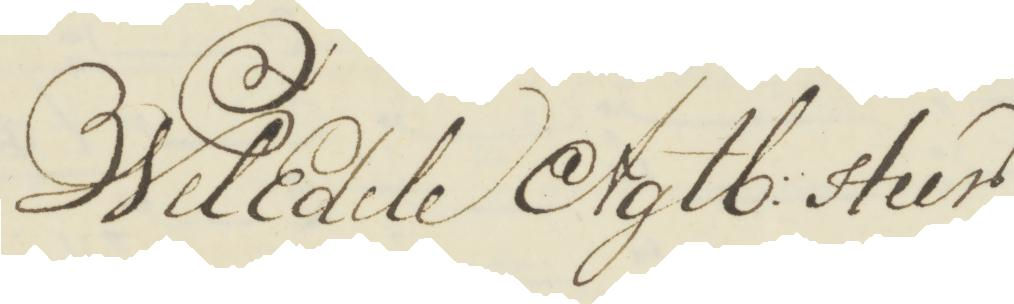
WelEdele Agtb: Heer
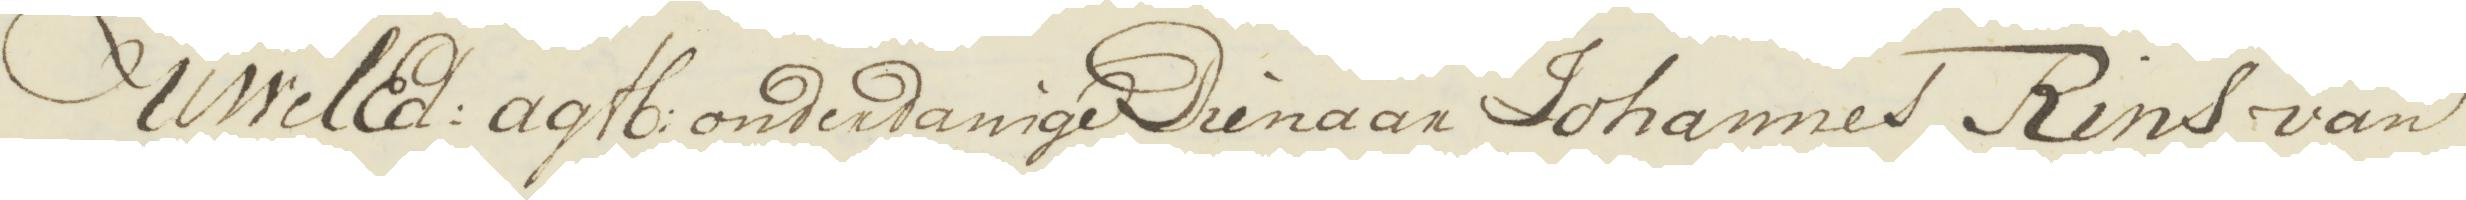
UWelEd: agtb: onderdanige Dienaar Iohannes Rins van
